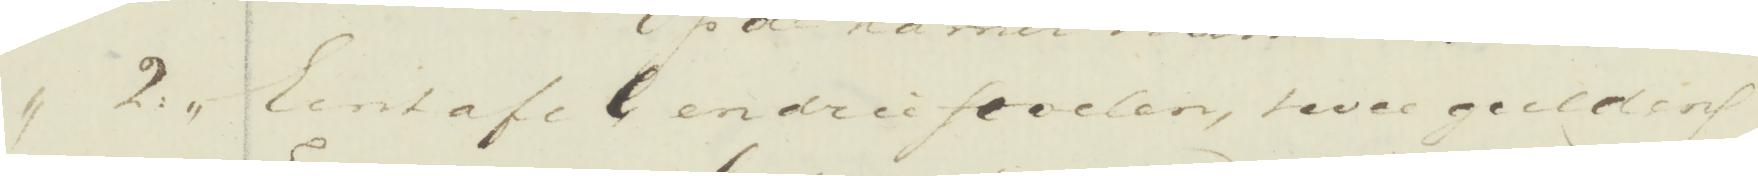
„ 2„ Een tafel en drie stoelen, twee guldens
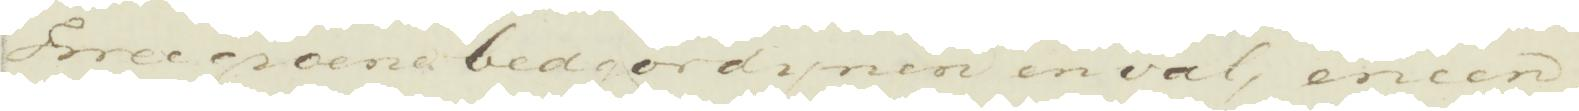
twee groene bedgordynen en val, en een
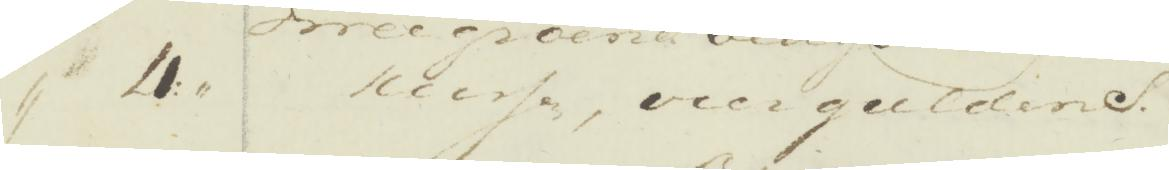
„ 4.„ keersen , vier guldens.
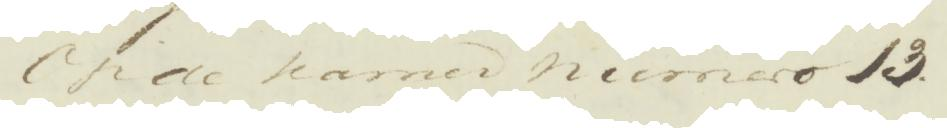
Op de kamer numero 13.
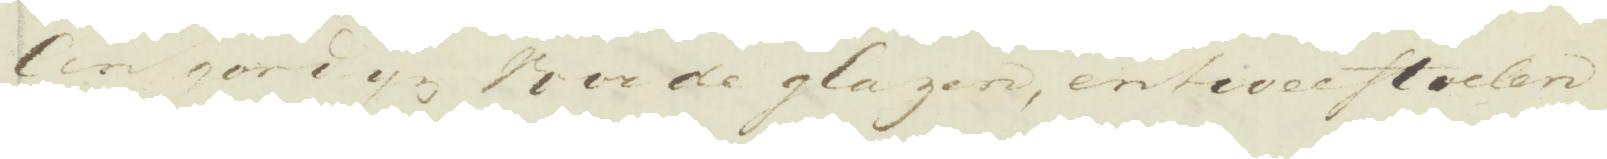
Een gordyn voor de glazen, en twee stoelen
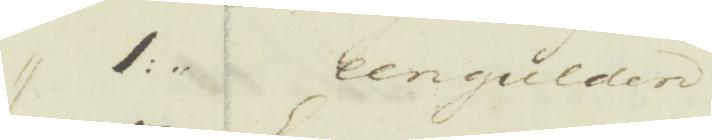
„ 1:„ een gulden
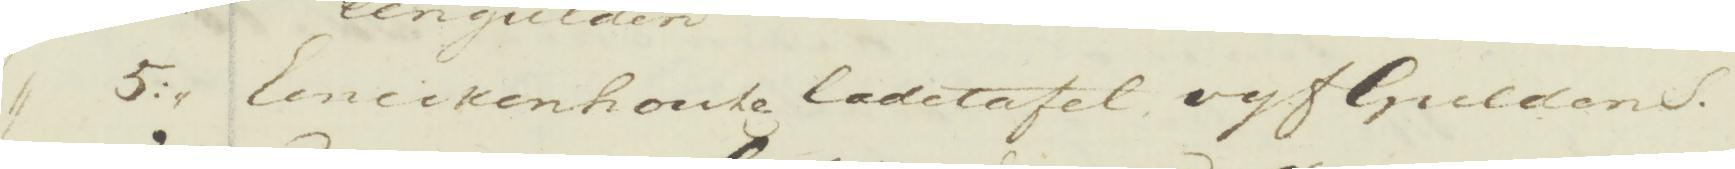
„ 5.„ Een eikenhoute ladetafel, vyf Guldens.
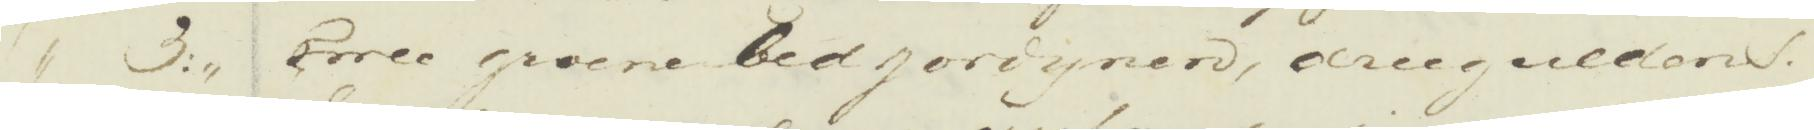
„ 3:„ Twee groene bed gordynen, drie guldens.
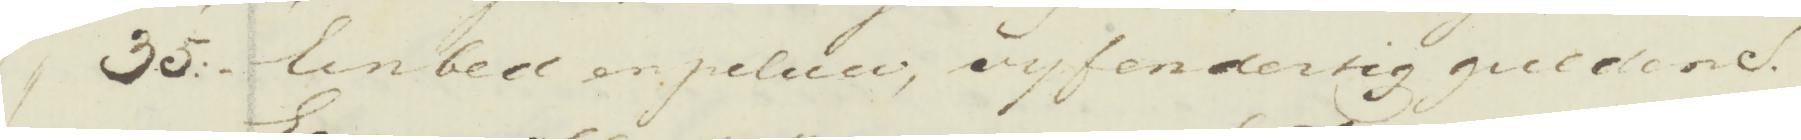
„ 35. Een bed en peluw, vyfendertig guldens.
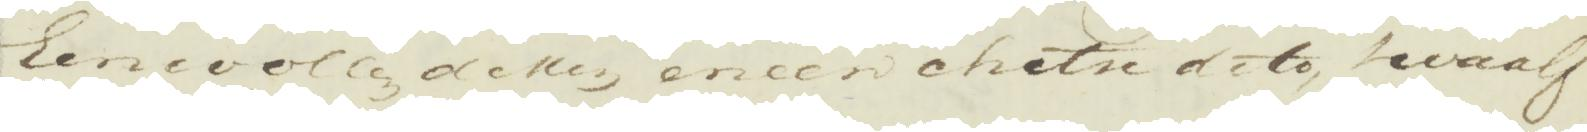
Een wollen deken en een chitse dito, twaalf
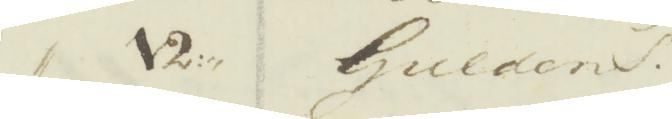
„ 12:„ Guldens.
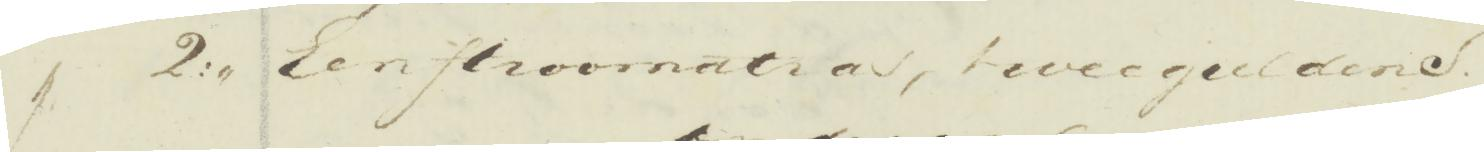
„ 2:„ Een stroomatras, twee guldens.
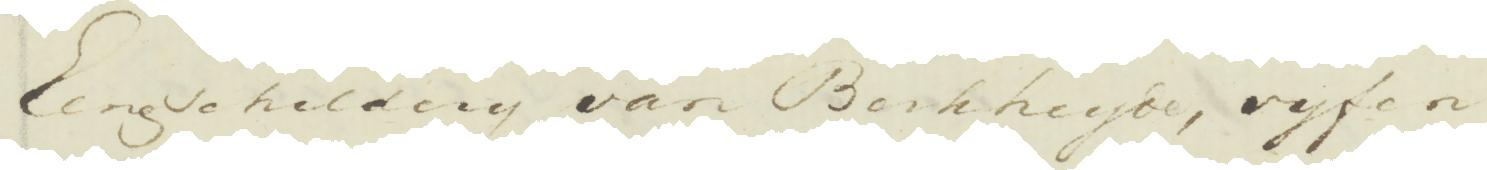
Een schildery van Berkheyde, vyfen
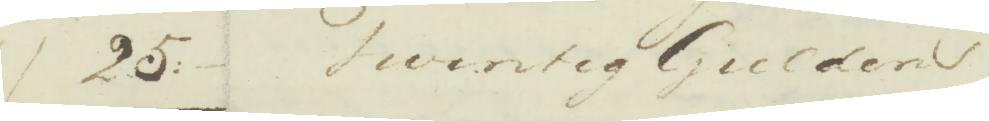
25: - twintig Guldens
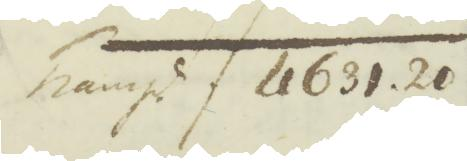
Transpt: ƒ 4631.20
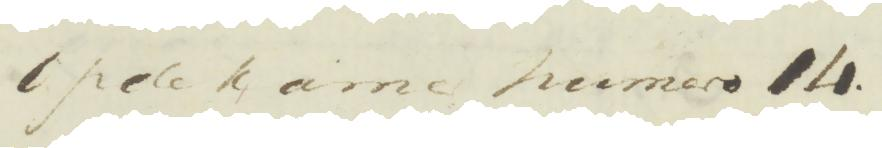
op de kamer numero 14.
